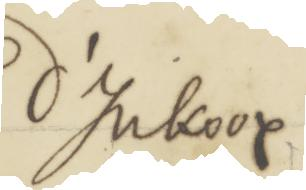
d' Jnkoop
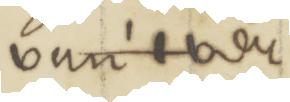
van 't ver
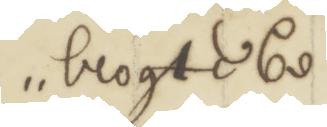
„kogte be
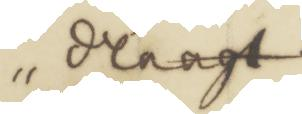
„draagt
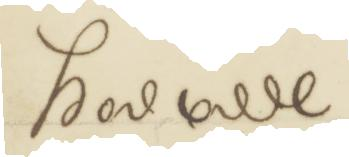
hoe veel
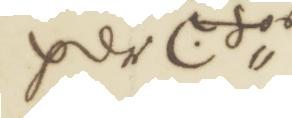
per C„tos
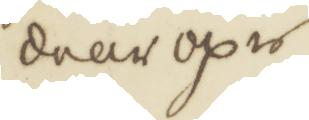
daar op is
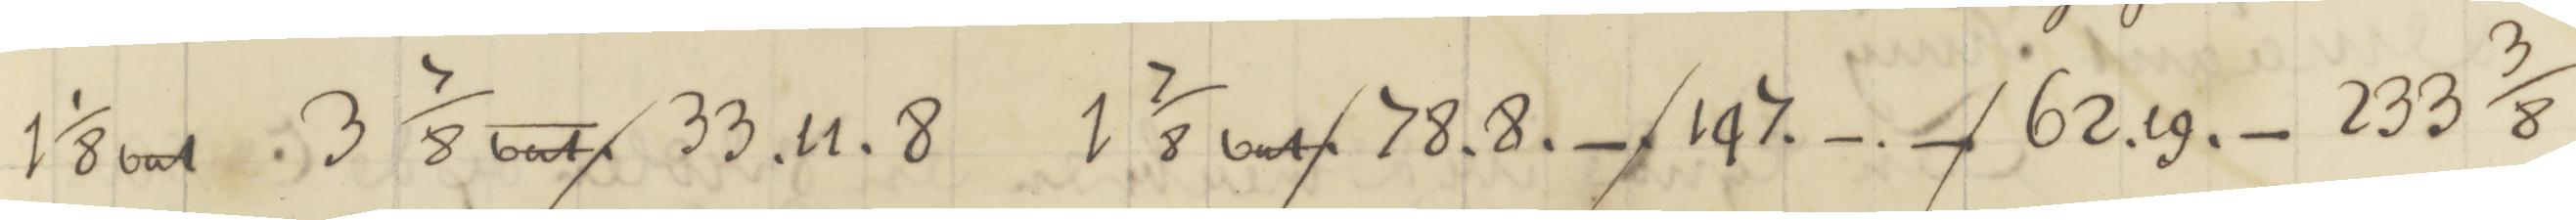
1 1/8 vat 3 7/8 vat ƒ 33.11.8 1 7/8 vat ƒ 78.8.— ƒ147.—.— ƒ 62.19.— 233 3/8
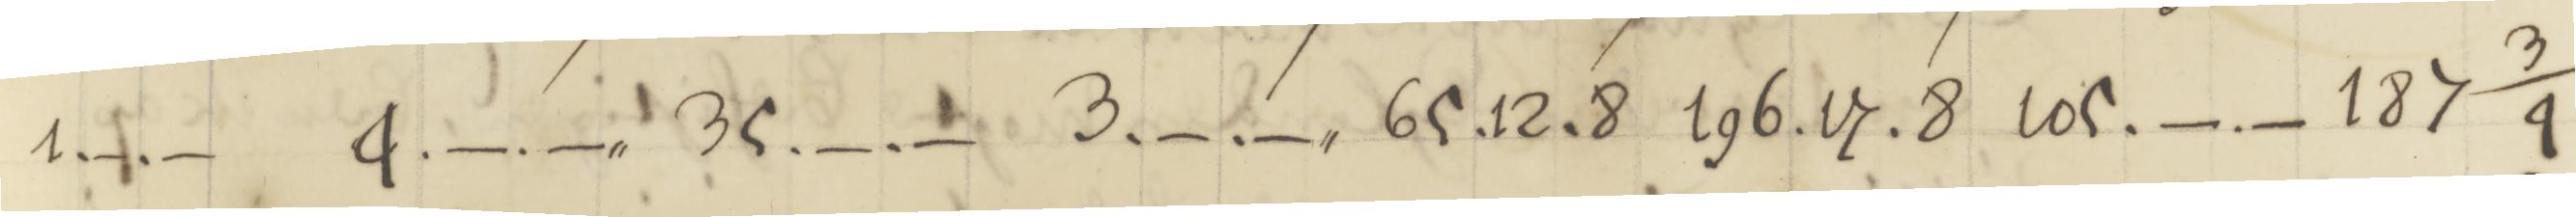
1.—.— 4.—.—„ 35.—.— 3.—.—„ 65.12.8.196.17.8 105.—.— 187¾
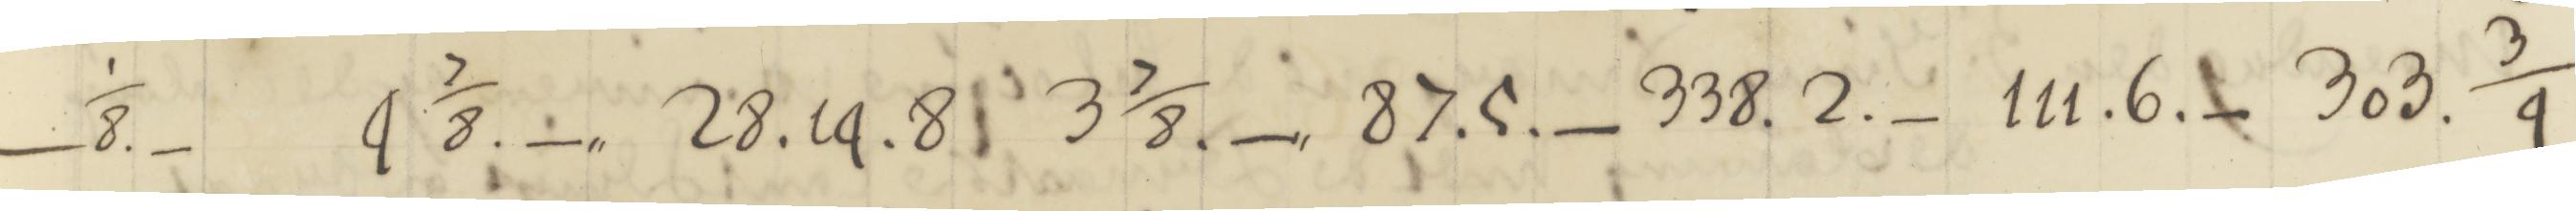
—1/8.— 4 7/8.—„ 28.14.8. 3 7/8. —„ 87.5.— 338.2.— 111.6.— 303.¾
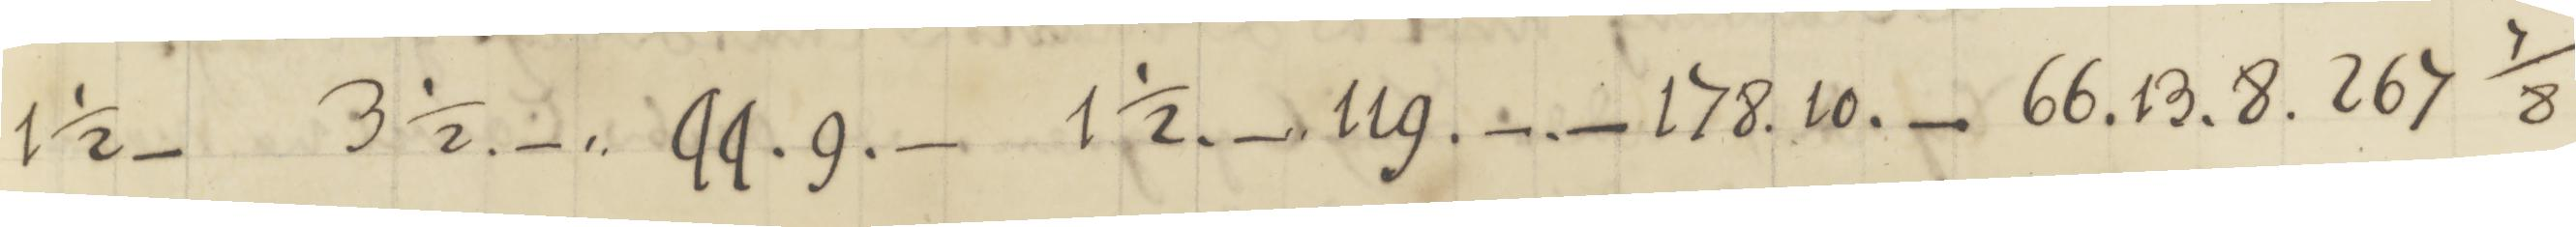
1½— 3½.— „ 44.9.— 1½.—„119. —.— 178.10.— 66.13.8. 267 7/8
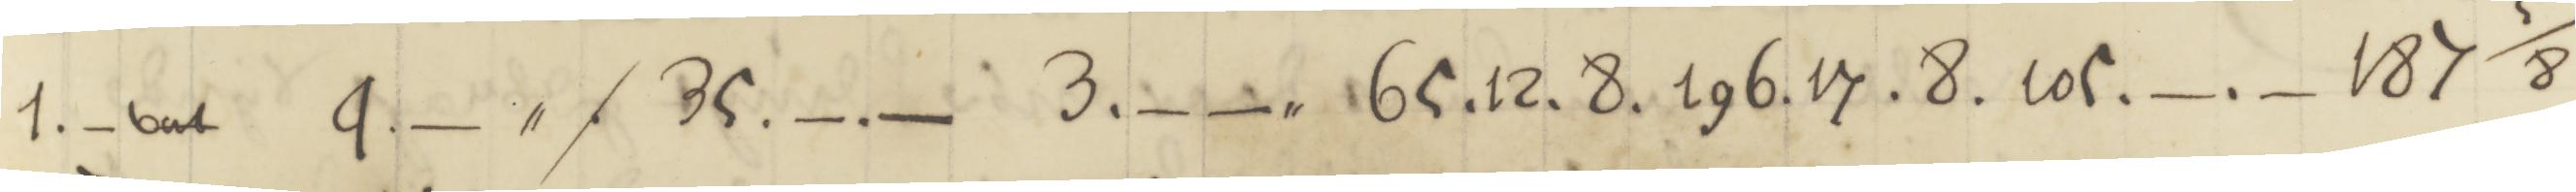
1.— vat 4.— „ ƒ 35.—.— 3.— —„ 65.12.8. 196.17.8. 105.—.—187 5/8
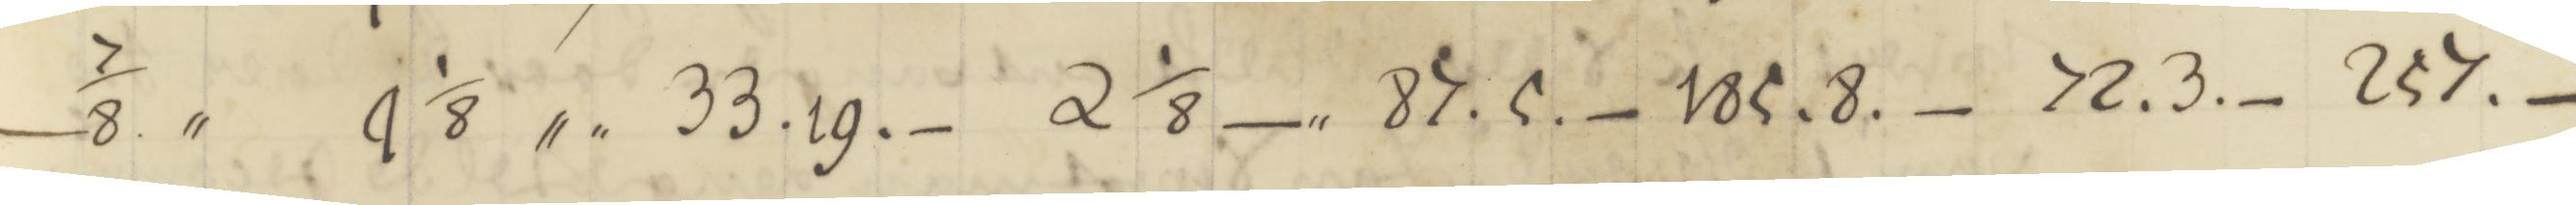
— 7/8 „ 4 1/8 „ „ 33.19.— 2 1/8 —„ 87.5.— 185.8.— 72.3.— 257.—
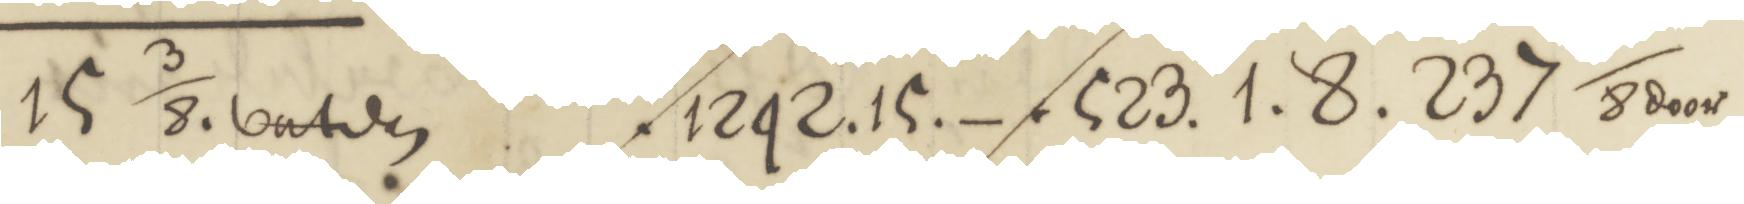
15 3/8. vaten ƒ 1242.15.—. ƒ523.1.8. 237 5/8 door
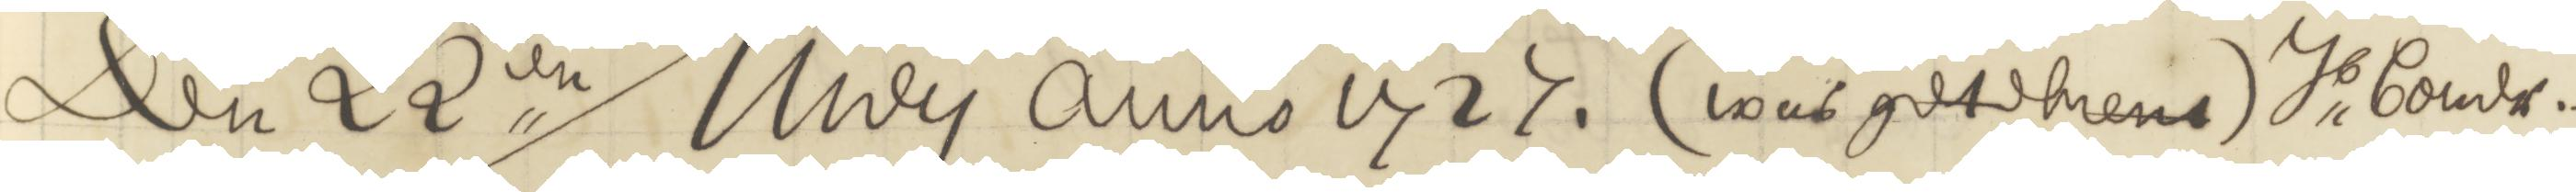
Den 22„en meij Anno 1727. (was getekent) J„b boner.
